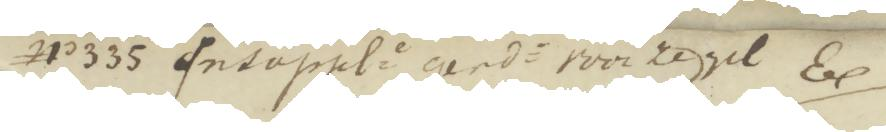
No 335 Insuppl=e gerd=e voor zegel Ex
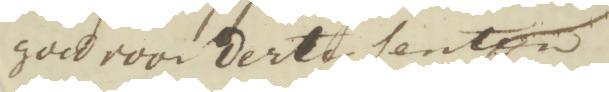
goed voor dertig Centen
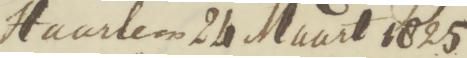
Haarlem 24 Maart 1825
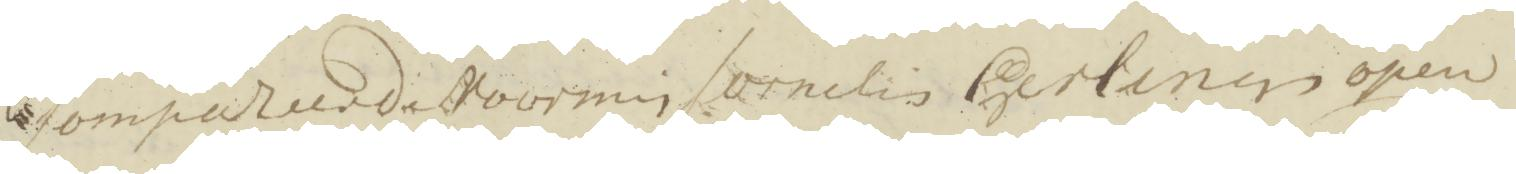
Compareerde Voormij Cornelis Gerlings open
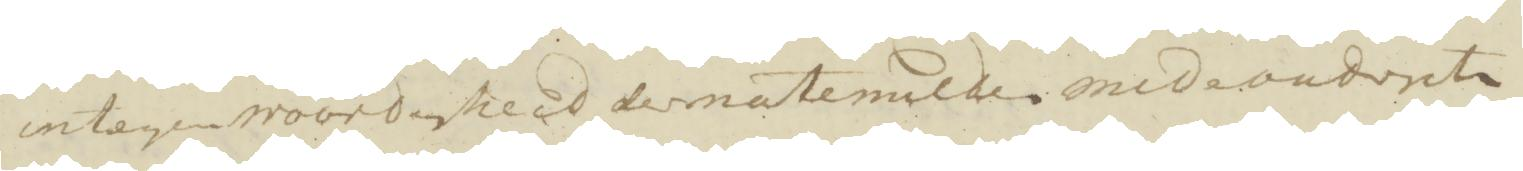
in tegenwoordigheid dernatemelde medeonderte
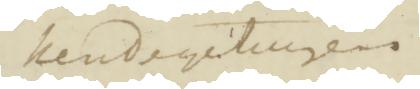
kende getuigen
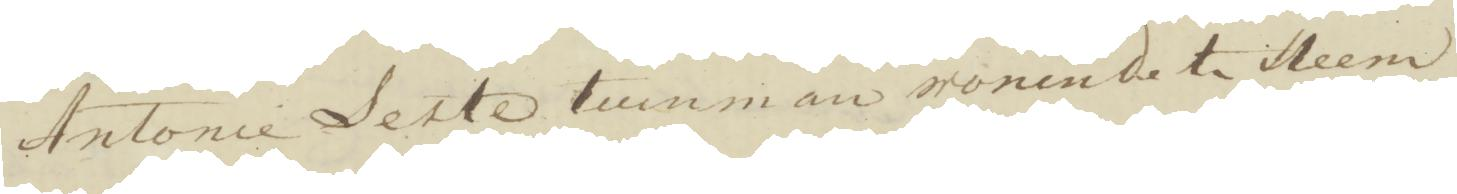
Antonie Leste tuinman wonende te Heem
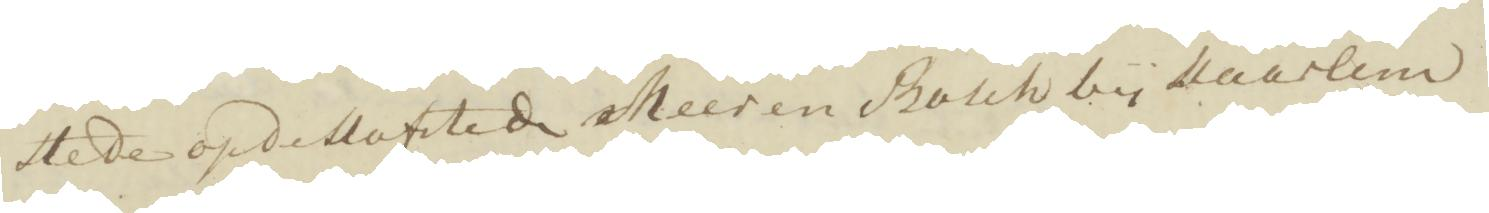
stede op de Hofstede Meer en Bosch bij Haarlem
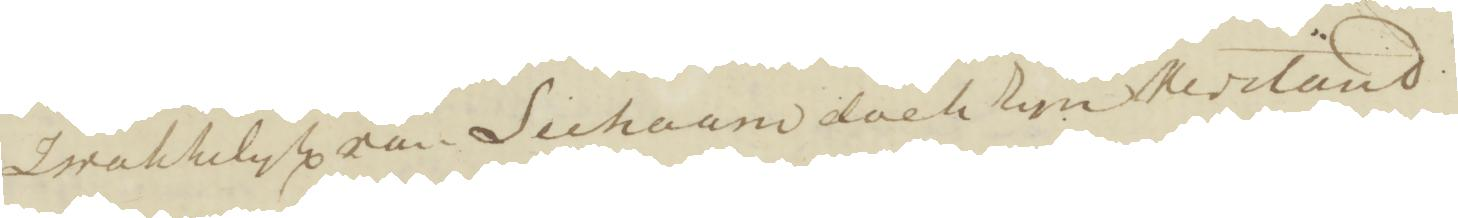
zwakkelijk van Lichaam doch zijn verstand
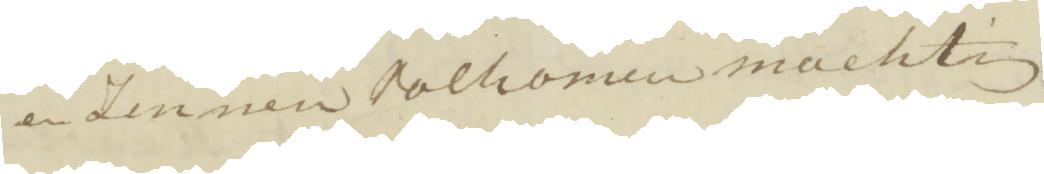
en zinnen volkomen machtig
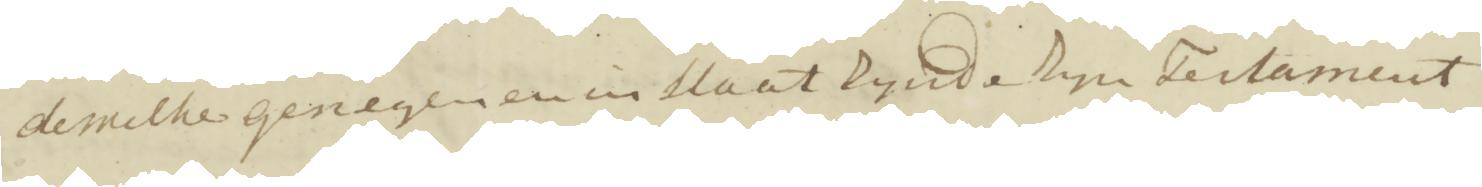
dewelke genegen en in staat zynde zyn Testament
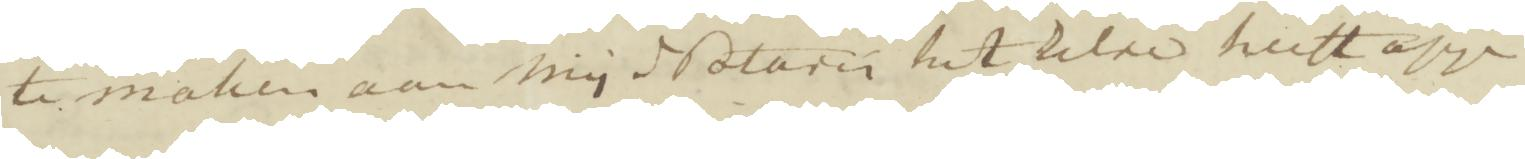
te maken aan mij Notaris het zelve heeft afge
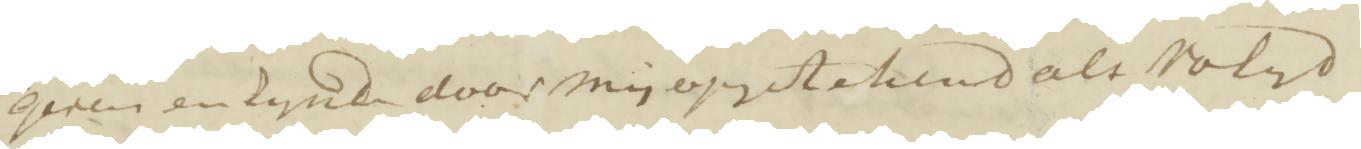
geven en zynde door mij opgetekend als volgd
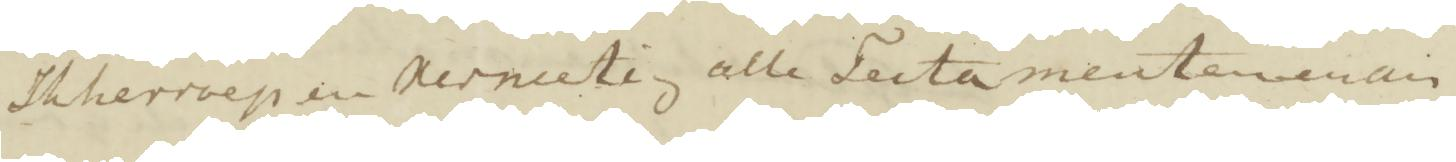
Ikherroep en vernietig alle Testamenten en an
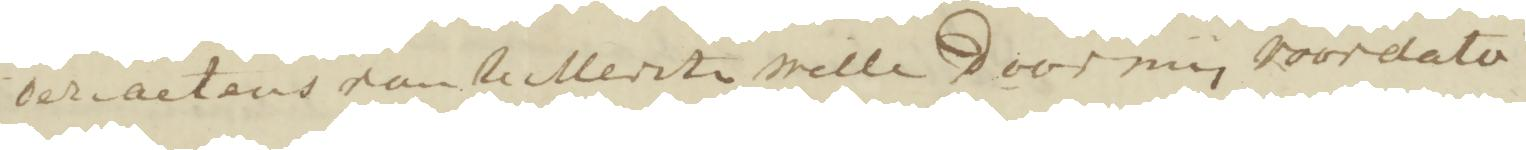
dere actens van uitterste wille door mij voordato
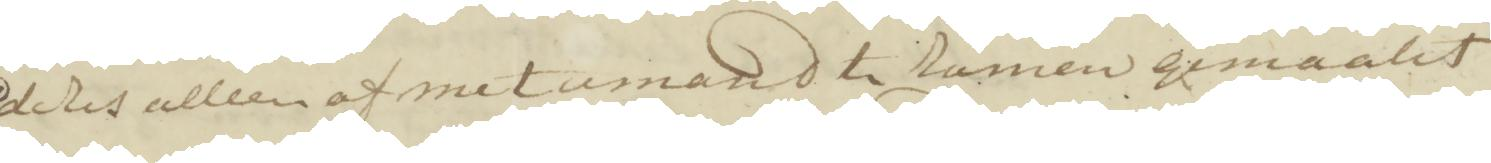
dezes alleen of met iemand te zamen gemaakt
